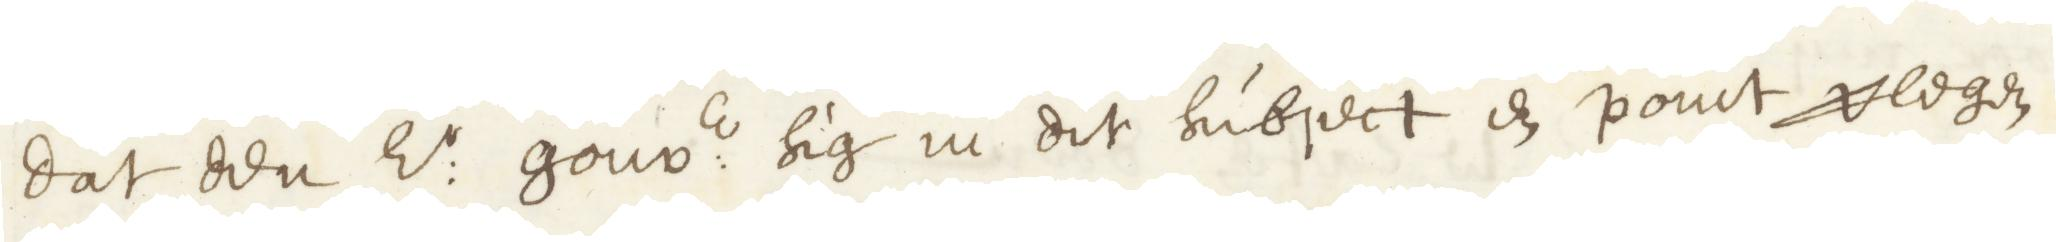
dat den h:r gouv:r sig in dit subject en point verlegen
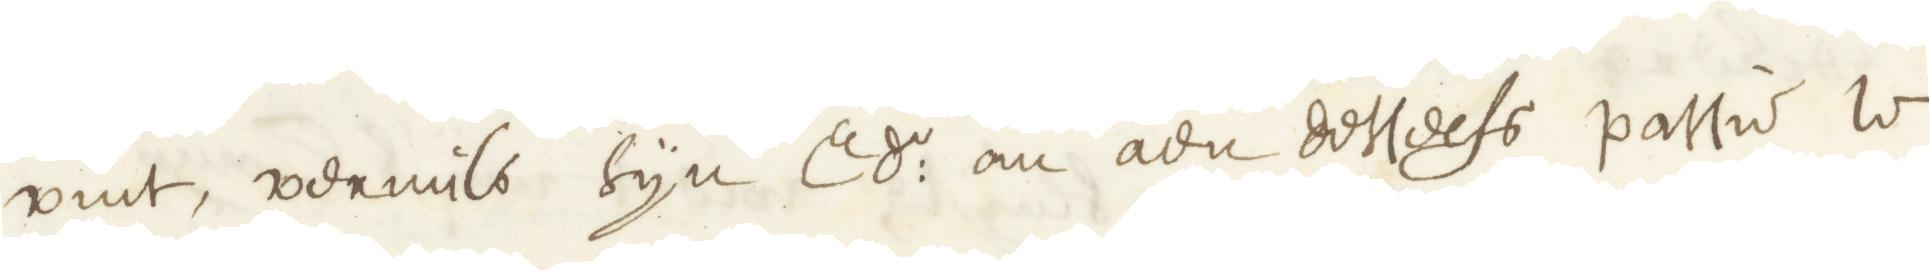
vint, vermits sijn Ed:e om aen desselfs passie te
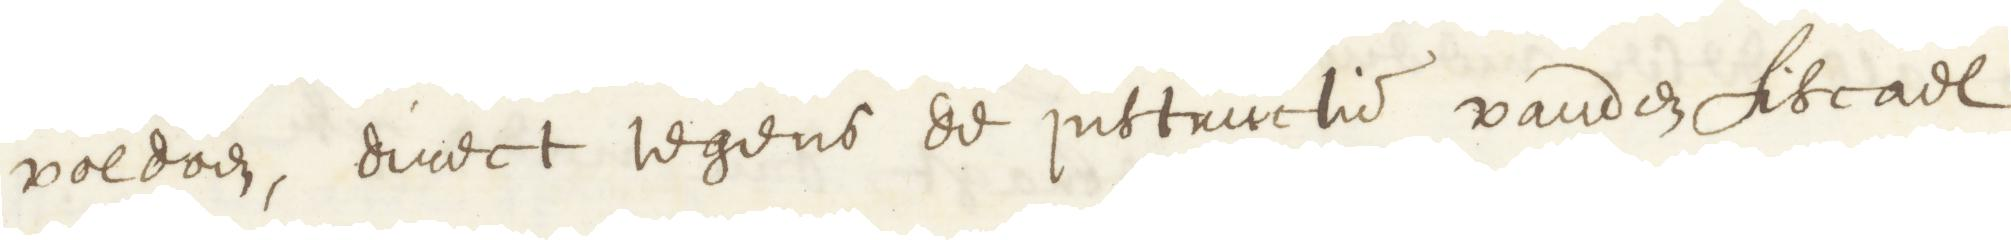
voldoen, direct tegens de instructie vanden fiscael
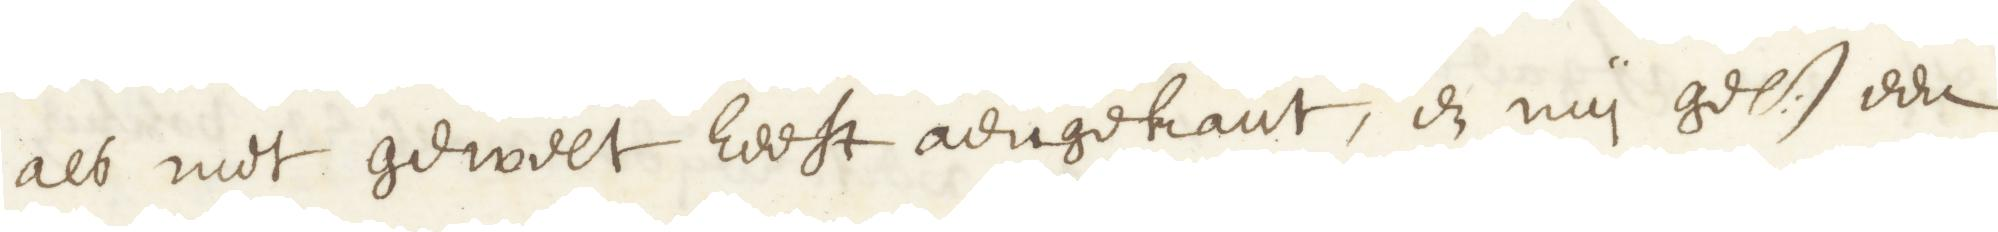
als met gewelt heeft aengekant, en mij gelijk een
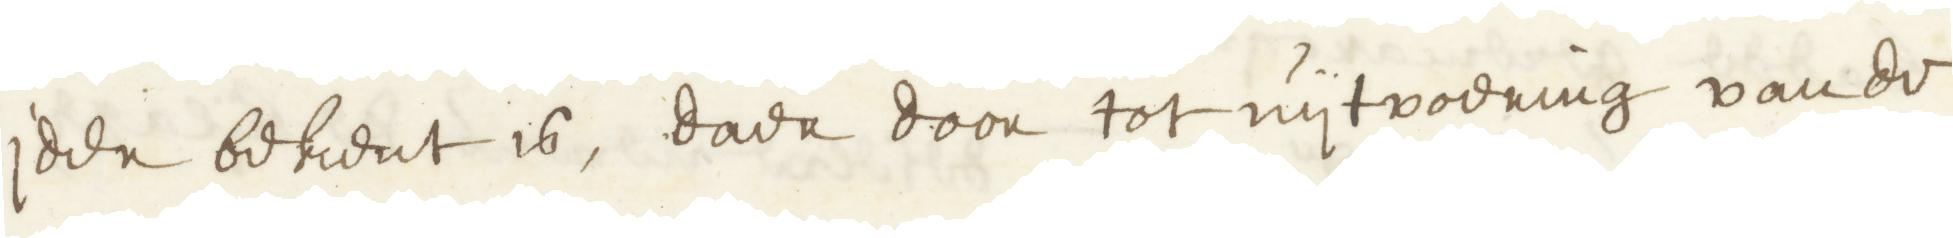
jder bekent is, daer door tot uijtvoering van de
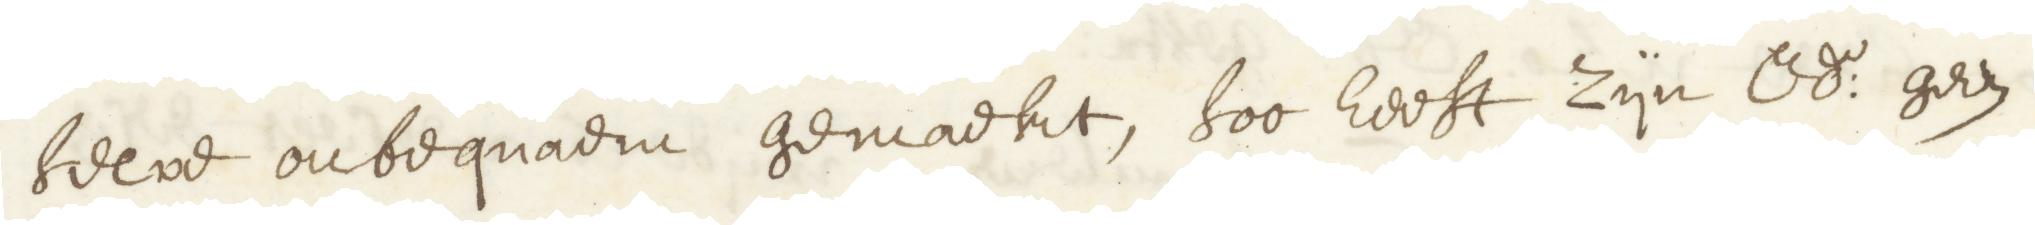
selve onbequaem gemaekt, soo heeft zijn Ed: geen
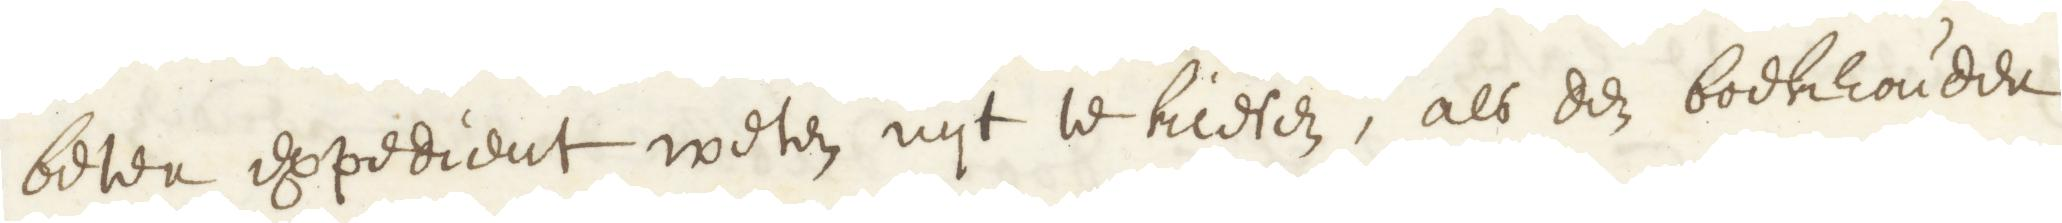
beter expedient weten uijt te kiesen, als den boekhouder
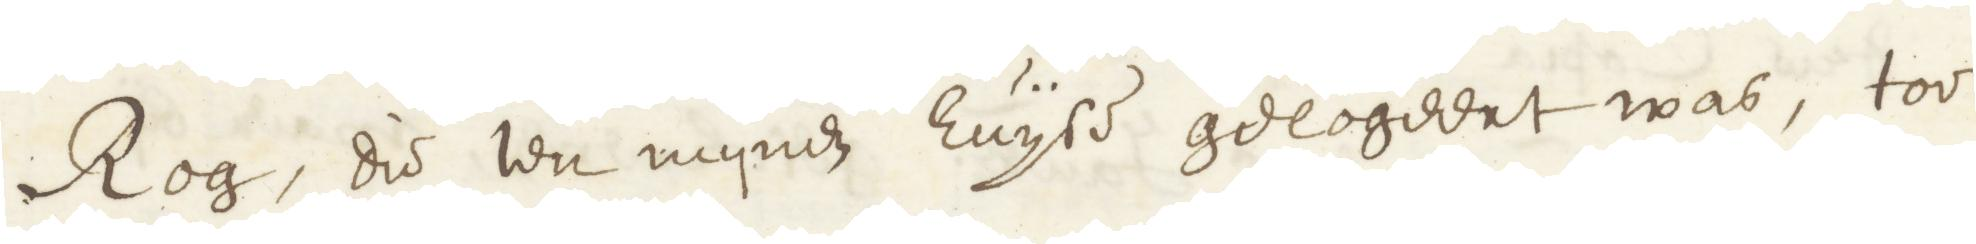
Rog, die ten mijnen huijse gelogeert was, toe
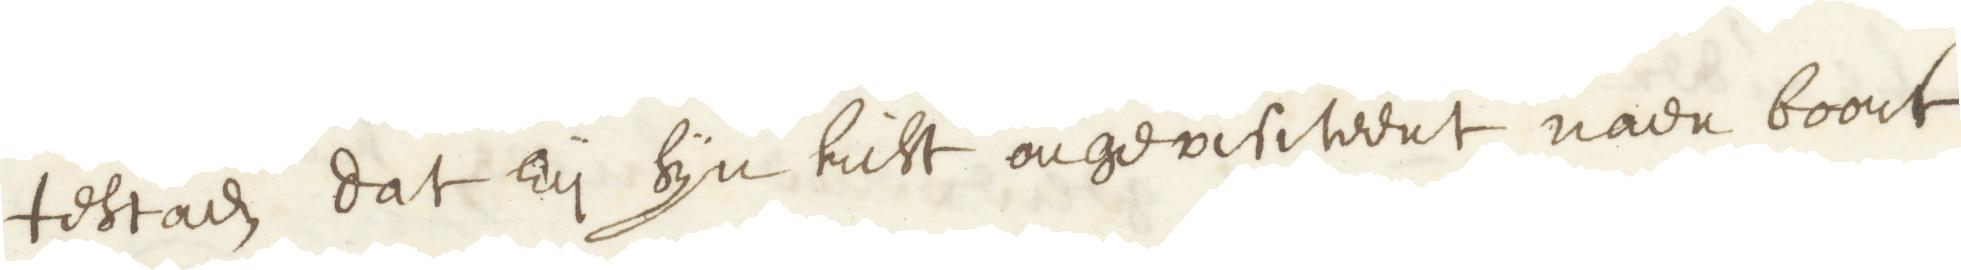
testaen dat hij sijn kist ongevisiteert naer boort
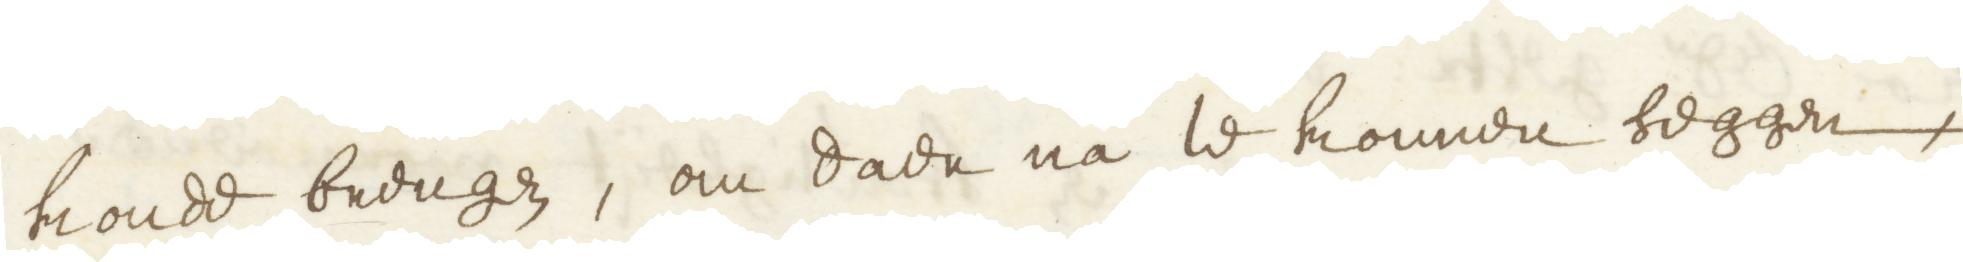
konde brengen, om daer na te konnen seggen,
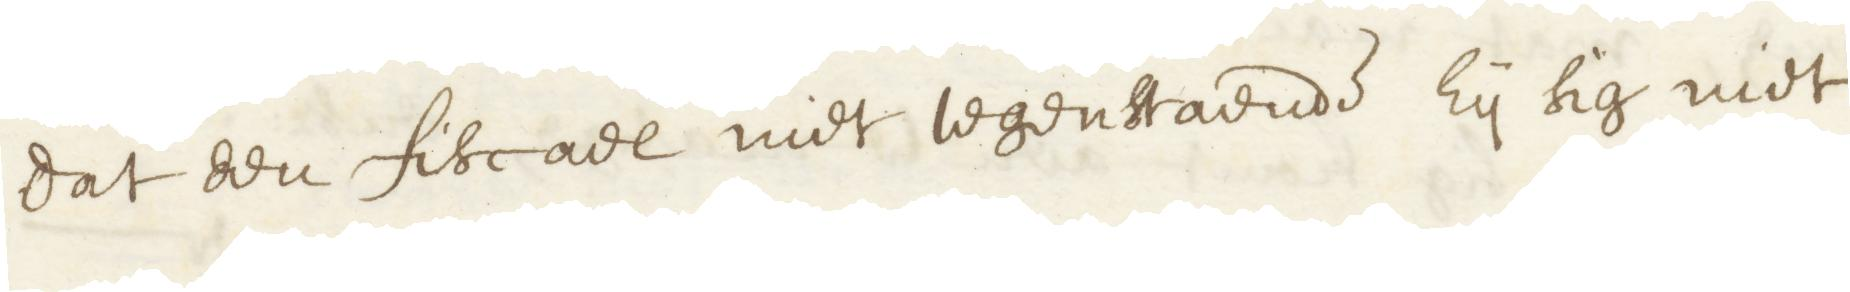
dat den fiscael niet tegenstaende hij sig niet
